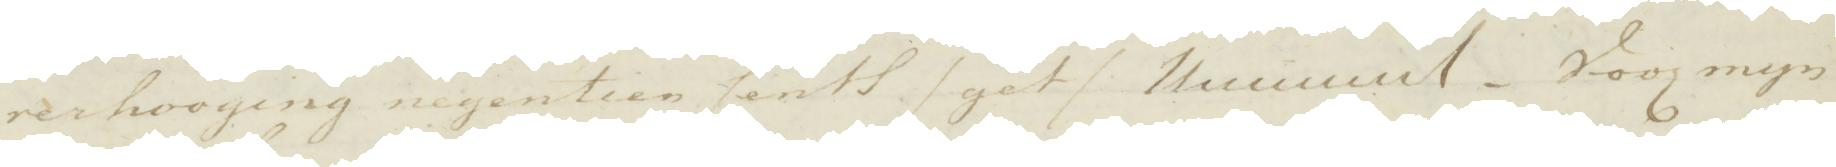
verhooging negentien Cents /get/ Hummit - Voor myn
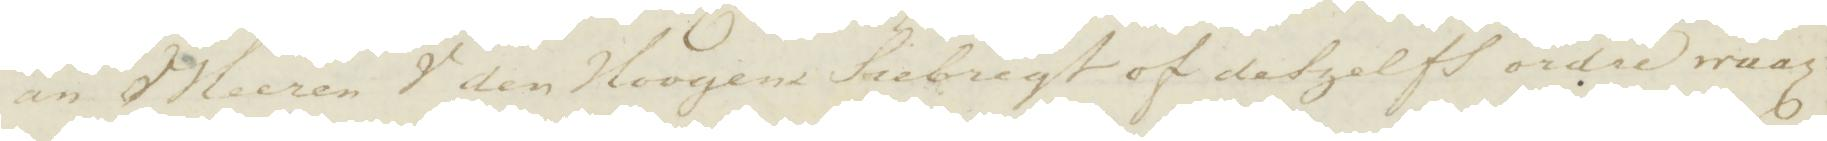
an d Heeren V den Hoogen Siebregt of deszelfs ordre waar
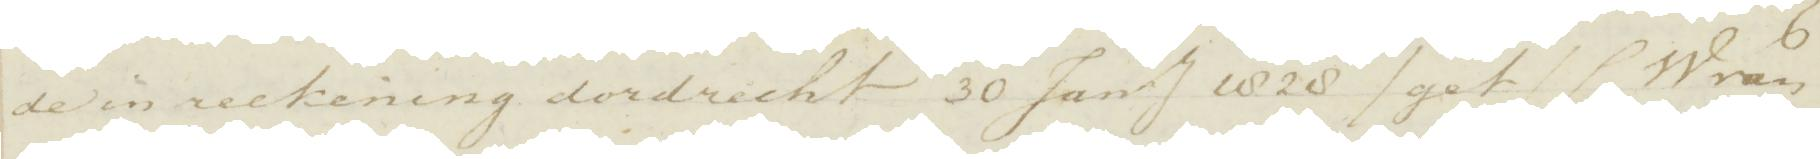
de in reekening dordrecht 30 Janij 1828 /get/ C W van
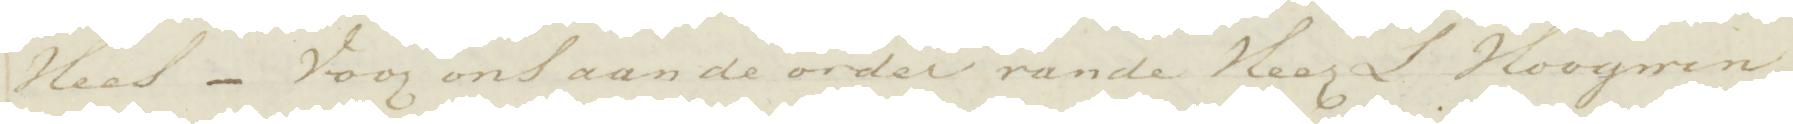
Hees – Voor ons aan de order van de Heer L Hoogwin
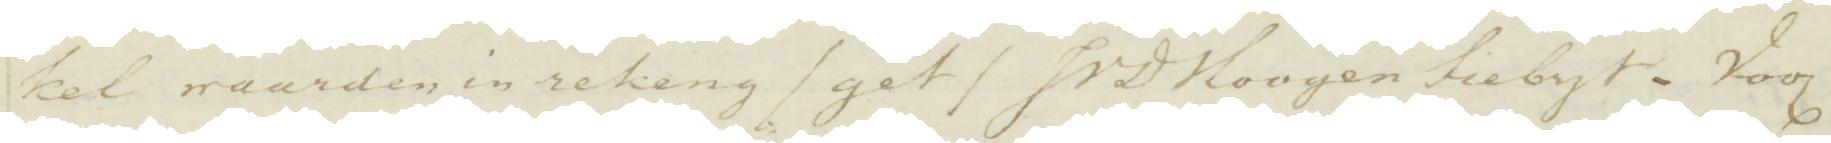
kel waarden in rekeng /get/ JvD Hoogen Siebregt - Voor
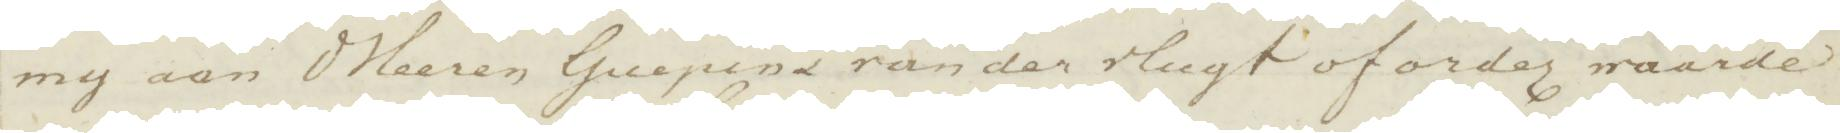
my aan d Heeren Guepine & van der vlugt of order waarde
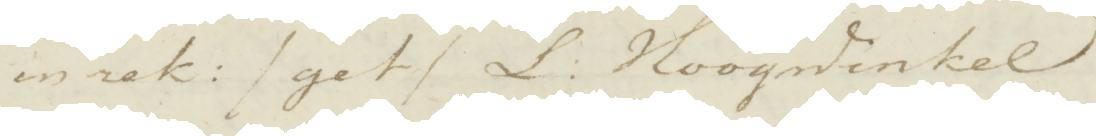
in rek: /get/ L: Hoogwinkel
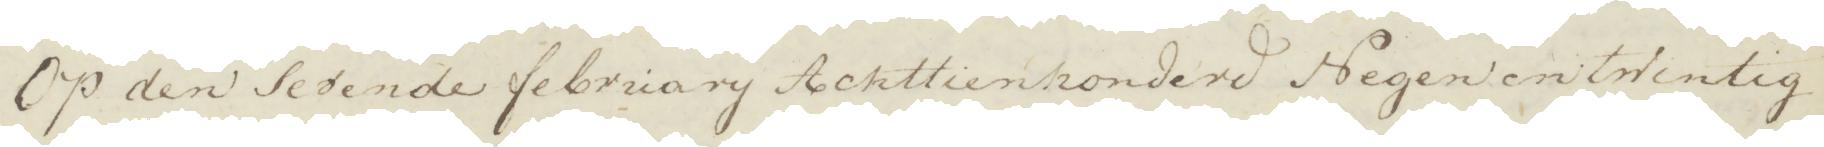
Op den sevende february Achttienhonderd Negen en twintig
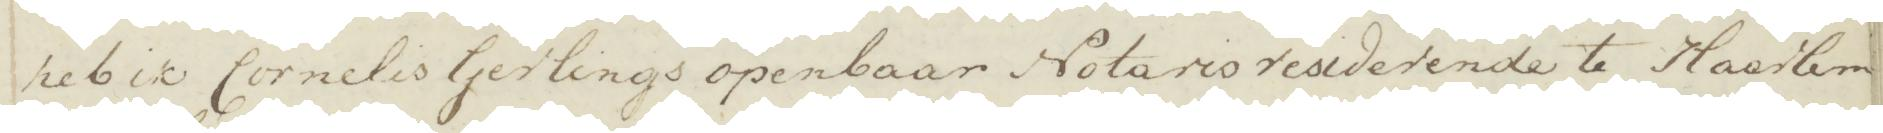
heb ik Cornelis Gerlings openbaar Notaris residerende te Haarlem
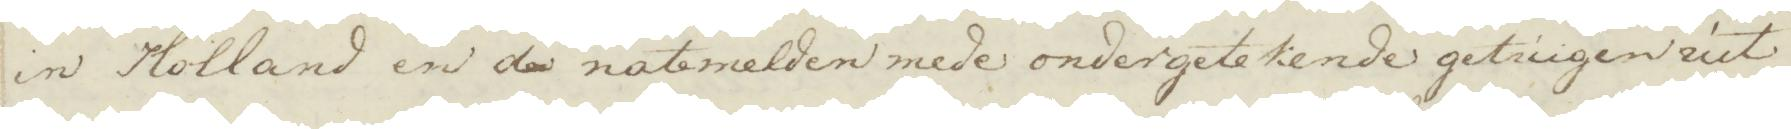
in Holland en de natemelden mede ondergetekende getuigen uit
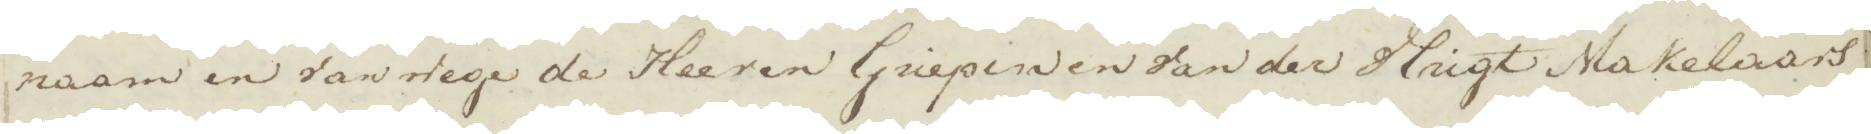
naam en van wege de Heeren Guepin en van der Vlugt Makelaars
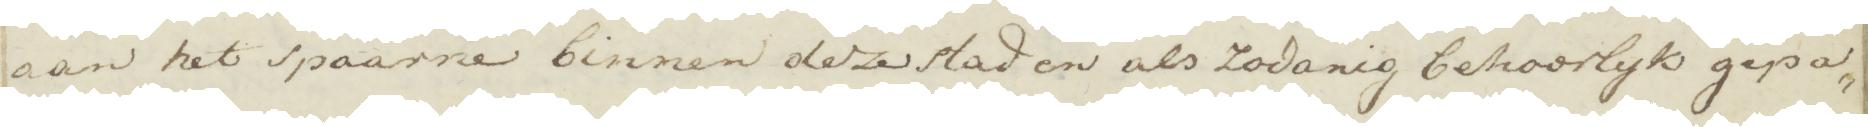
aan het spaarne binnen deze stad en als zodanig behoorlyk gepa„
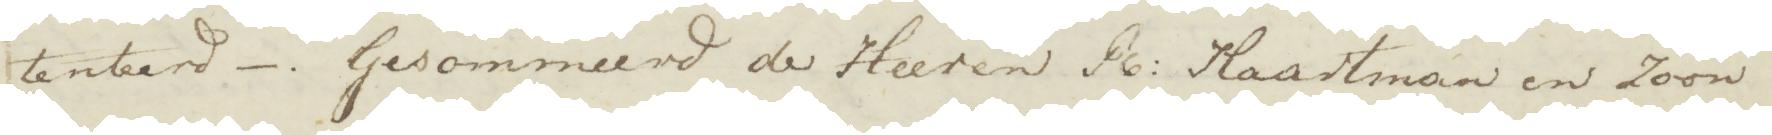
tenteerd –. Gesommeerd de Heeren R: Haartman en zoon
